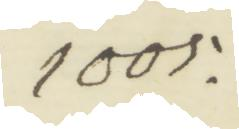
1005.
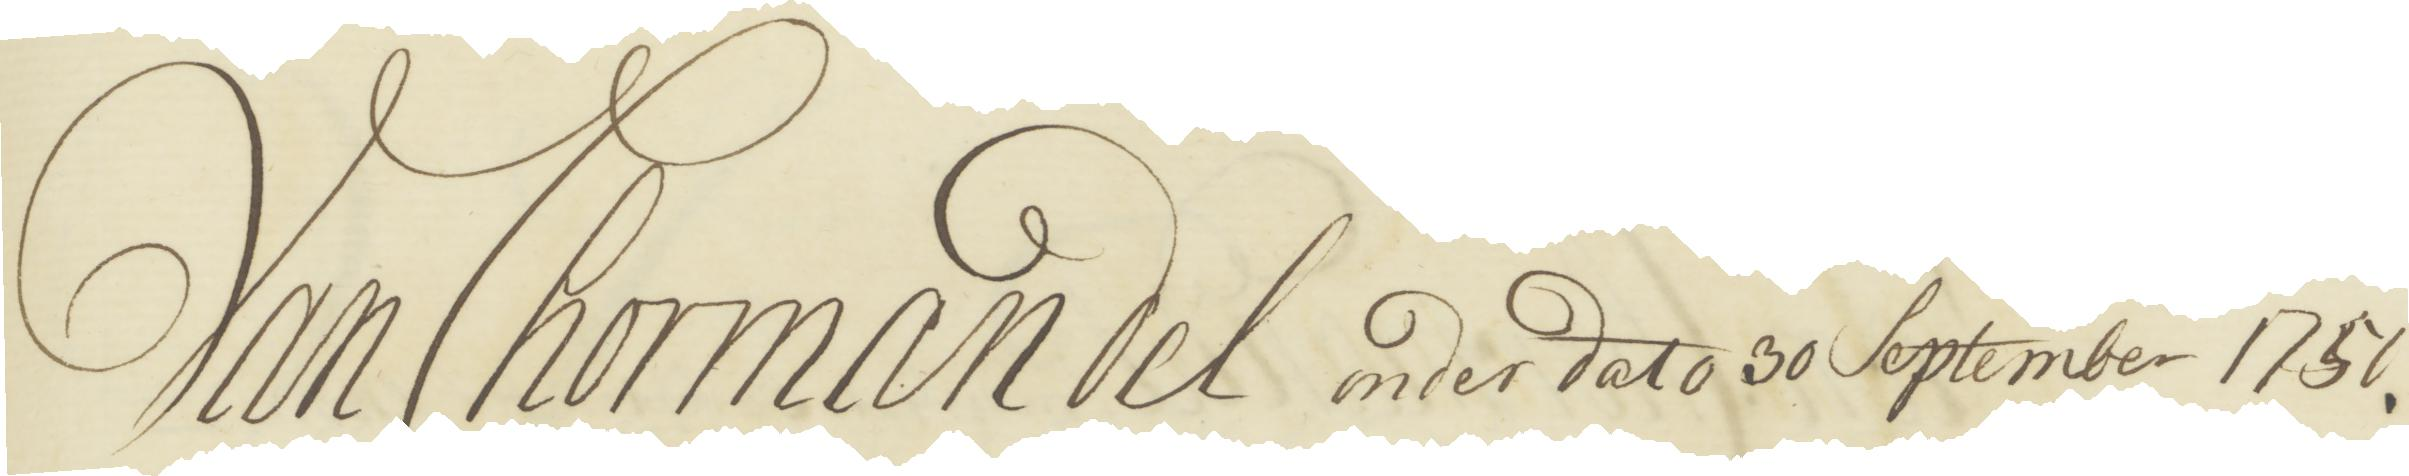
Van Chormandel onder dato 30 September 1751.
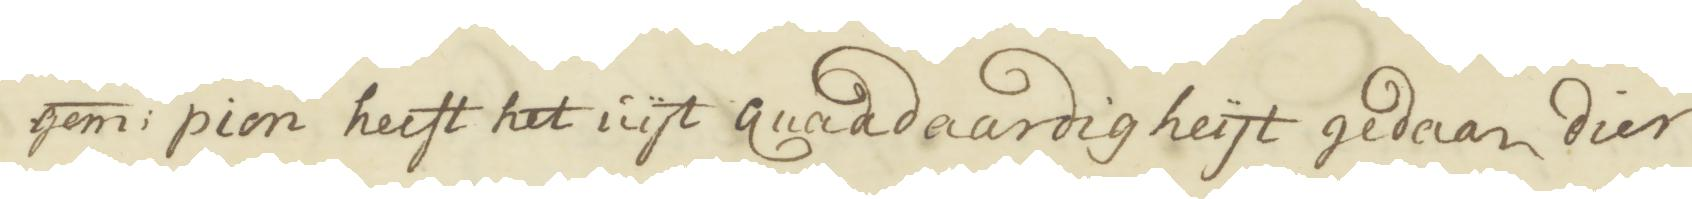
gem: pion heeft het uijt quaadaardigheijt gedaan dier
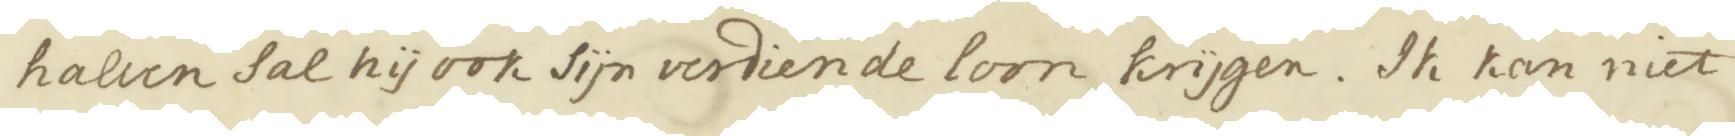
halven sal hij ook sijn verdiende loon krijgen. Ik kan niet
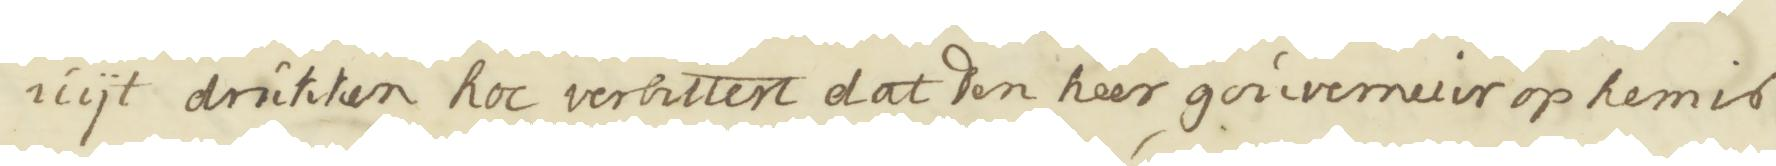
uijt drukken hoe verbittert dat den heer gouverneur op hem is
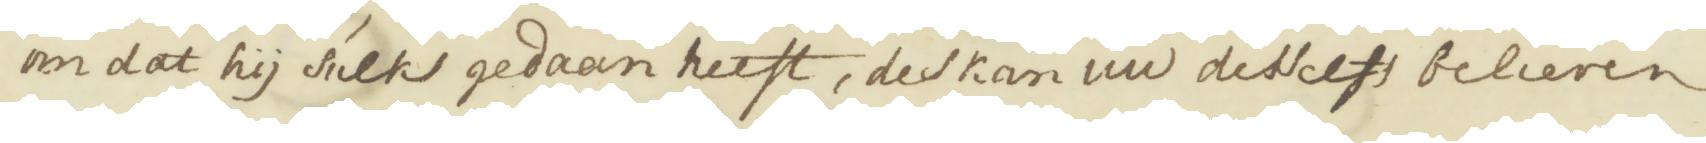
om dat hij sulks gedaan heeft, des kan uw desselfs believen
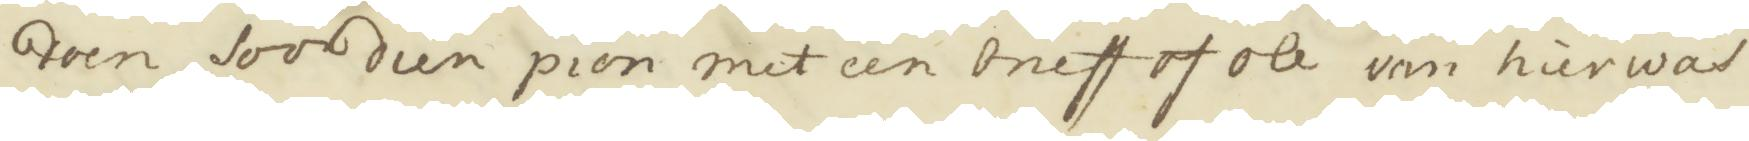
doen soo dien pion met een brieff of ole van hier was
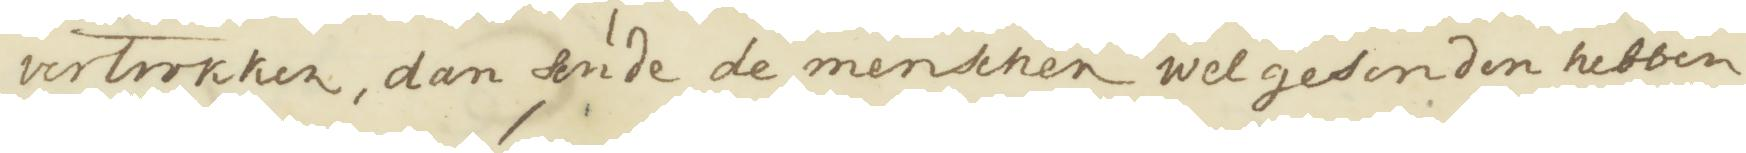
vertrokken, dan soude de menschen wel gesonden hebben
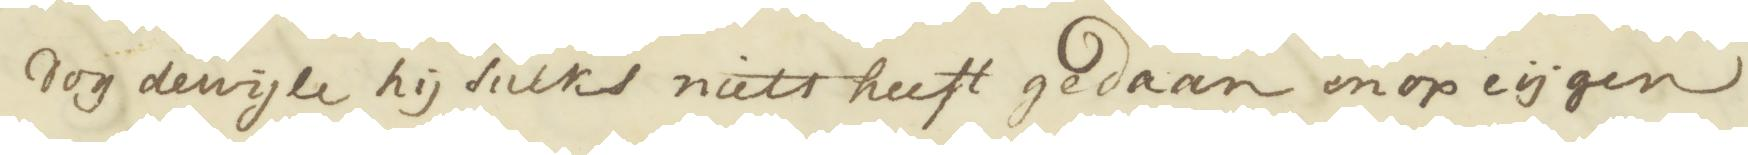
dog dewijle hij sulks niets heeft gedaan en op eijgen
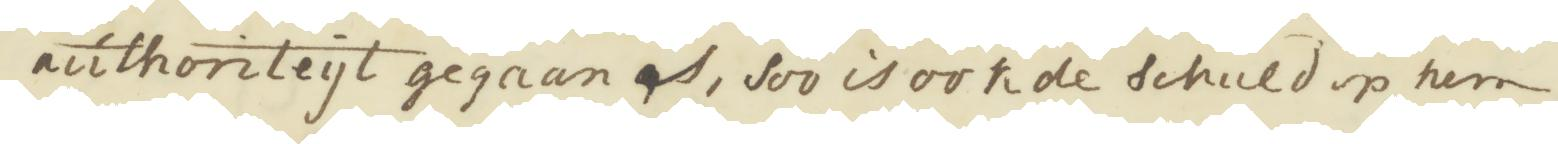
authoriteijt gegaan is, soo is ook de schuld op hem
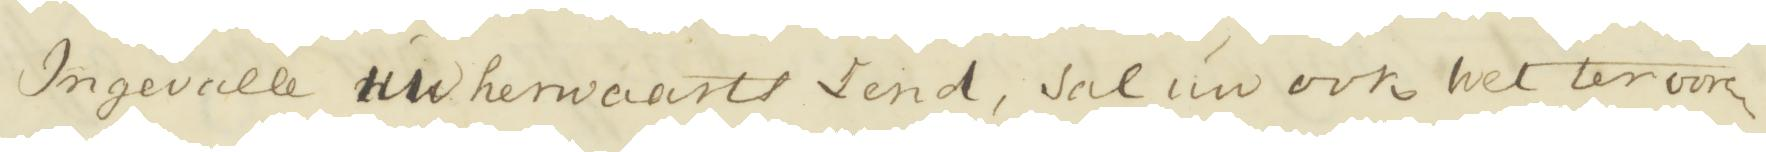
Jngevalle uw herwaarts send, sal uw ook wel ter ooren
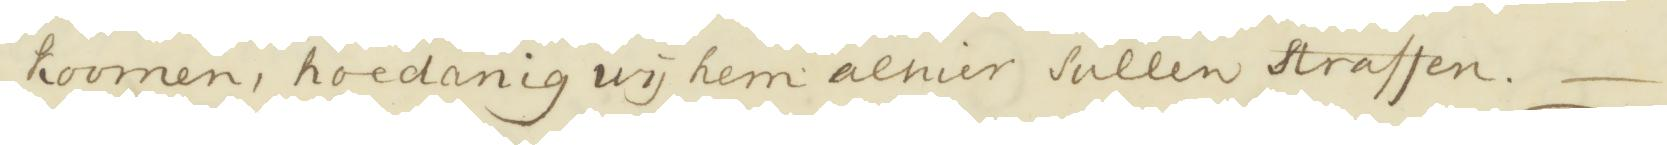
koomen, hoedanig wij hem alhier sullen straffen. —
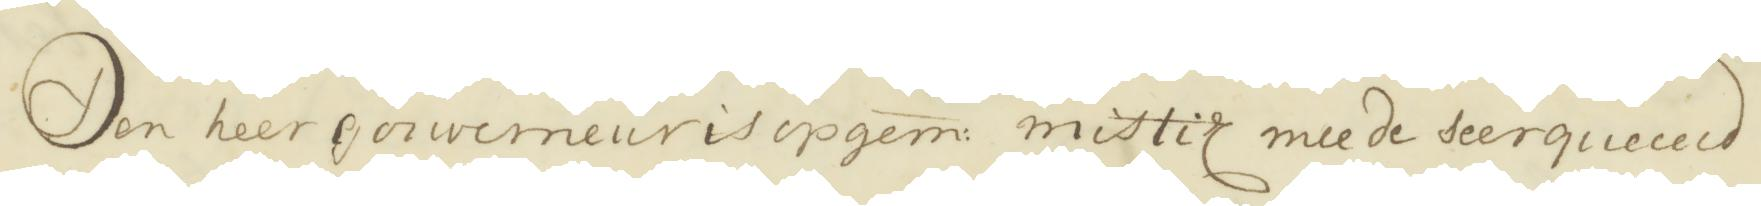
Den heer gouverneur is op gem: mistix meede seer quaad
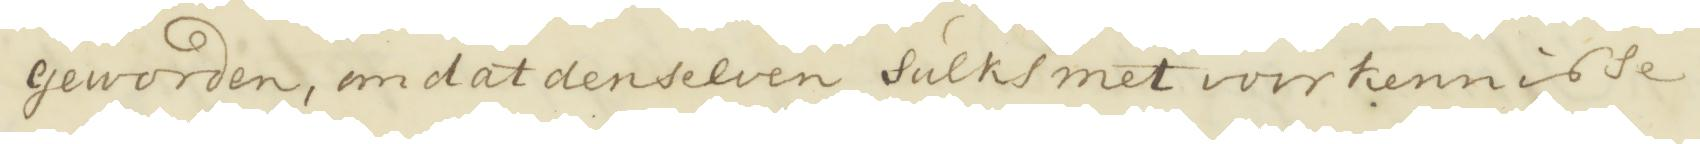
geworden, om dat denselven sulks met voor kennisse
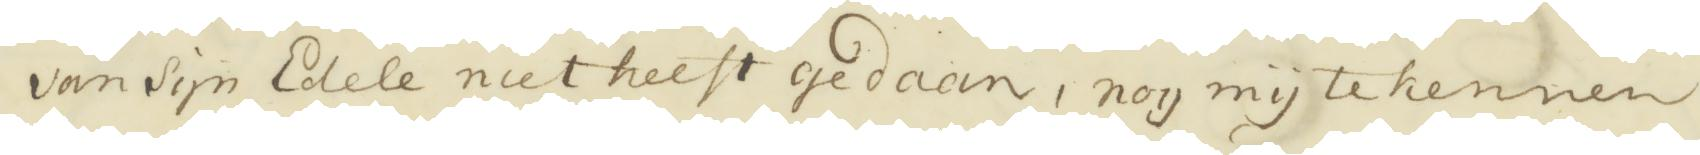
van sijn Edele niet heeft gedaan, nog mij te kennen
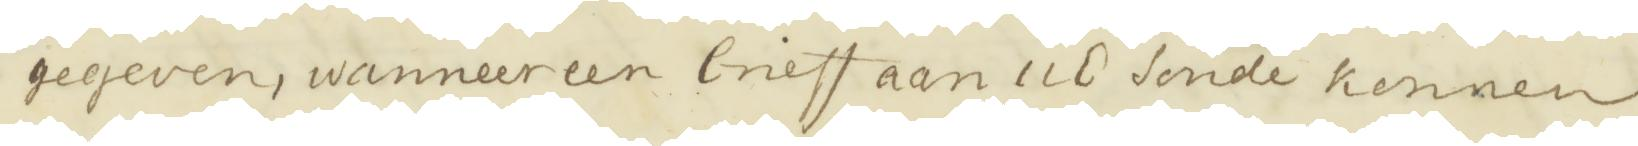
gegeven, wanneer een brieff aan uE soude kennen
